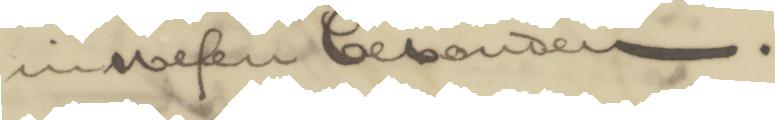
in wesen bevonden.
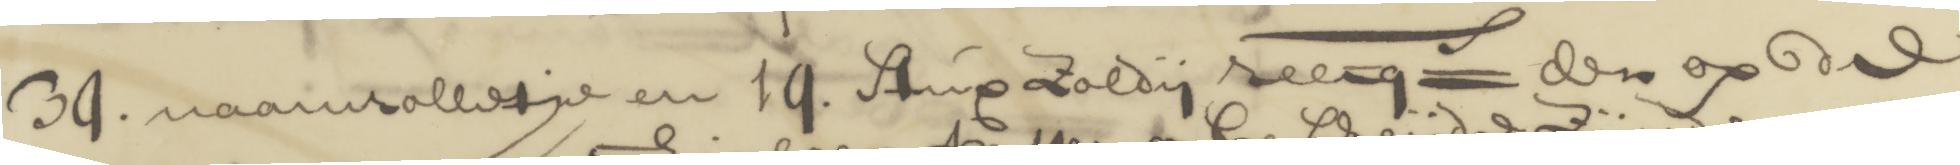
34. naamrolletje en 14. Stux Zoldij reecq=s den op de
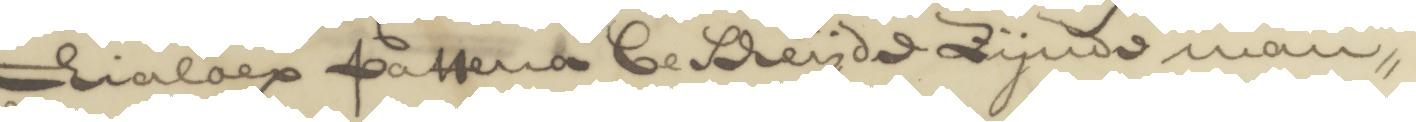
Chialoep pattena bescheijde Zijnde man„
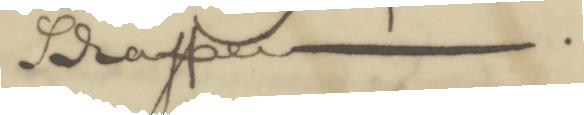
schappen-.
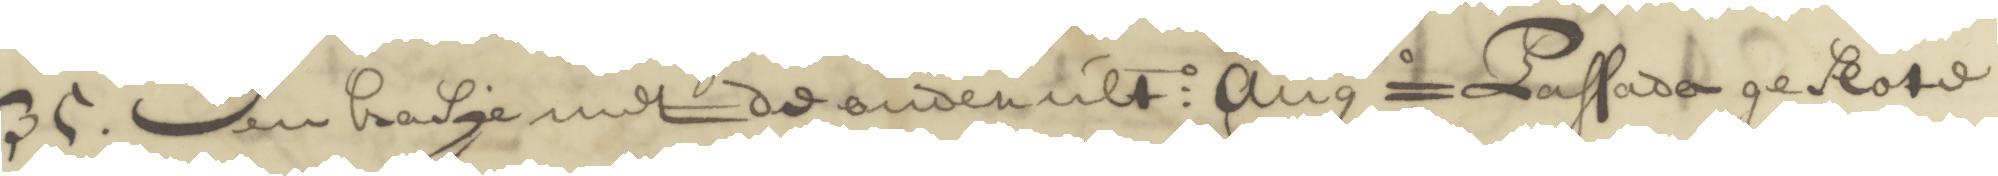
35. Een kasje met de onder ult:o Aug=o Passado geslote
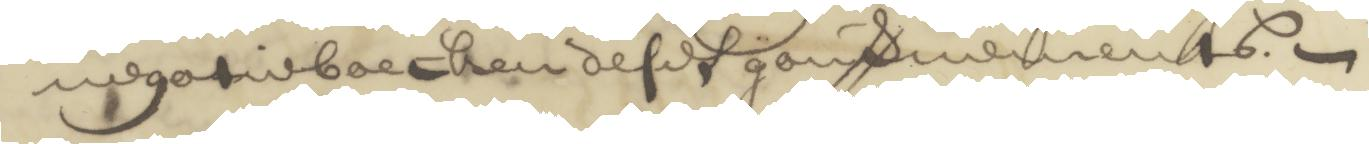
negotieboecken deses gouvernements.-
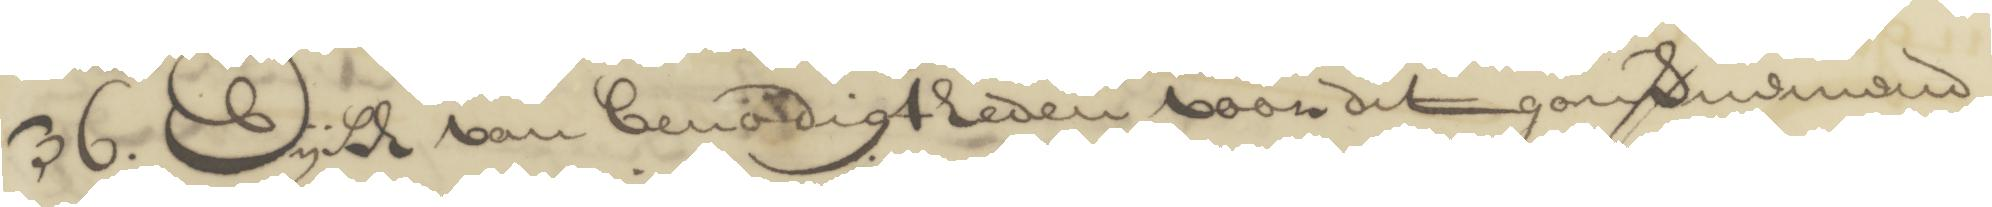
36. Eijsch van benodigtheden voor dit gouvernemend
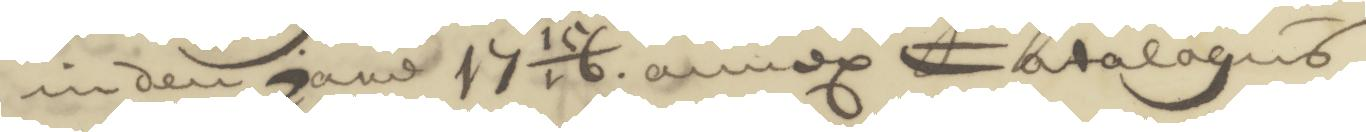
in den jare 17 15/16. annex Catalogus
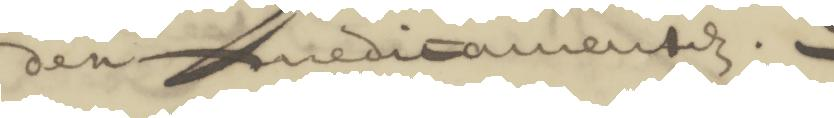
der medicamenten.-
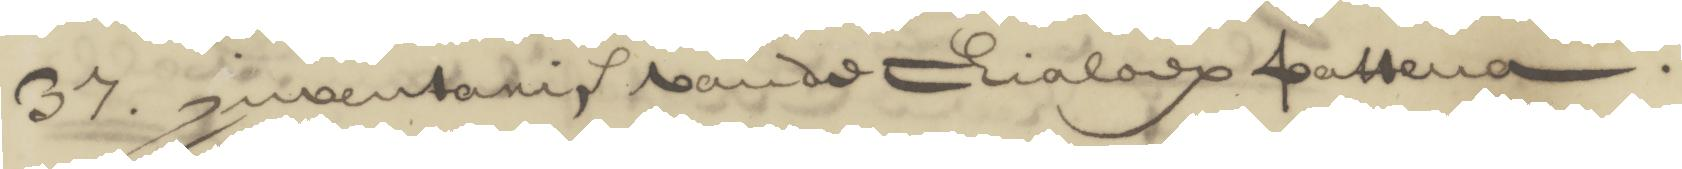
37. jnventaris vande Chialoep pattena.
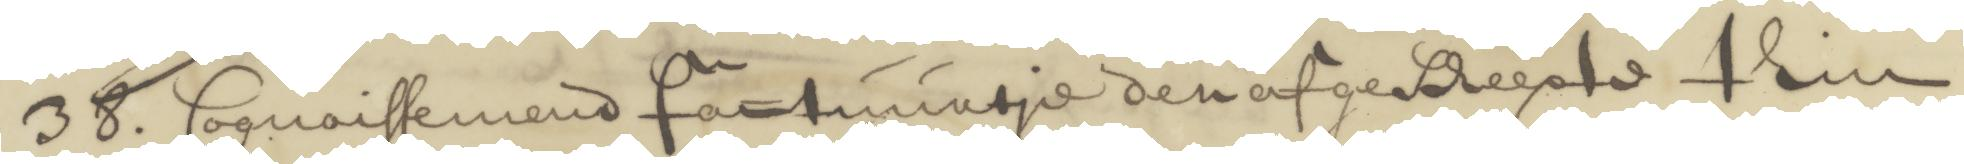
38. Cognoissemend factuurtje der afgescheepte thin
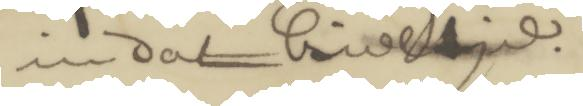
in dat kieltje.
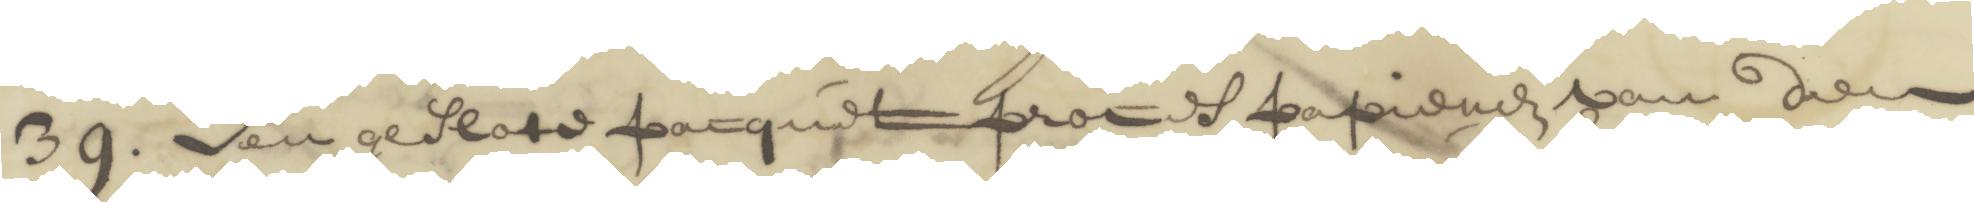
39. Een geslote pacquet proces papieren van den
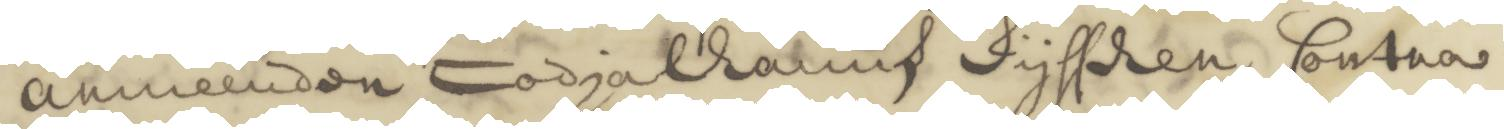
armeender Codjalhanus Eijsschen, Contra
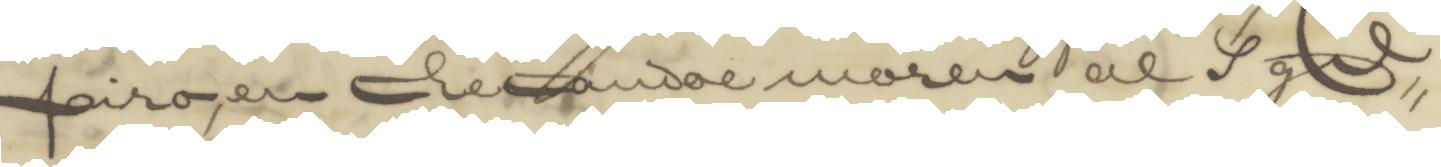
piro, en checandoe moren als ge„
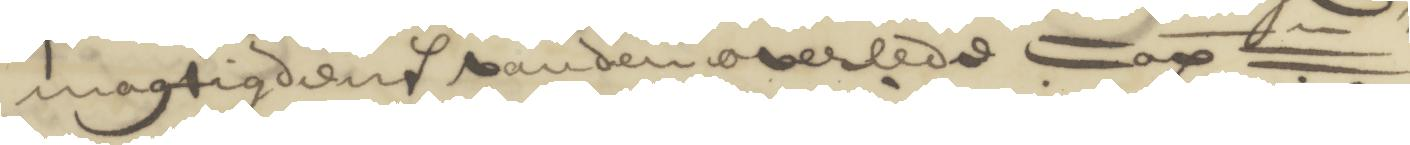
magtigdens van den overlede Cap=n
